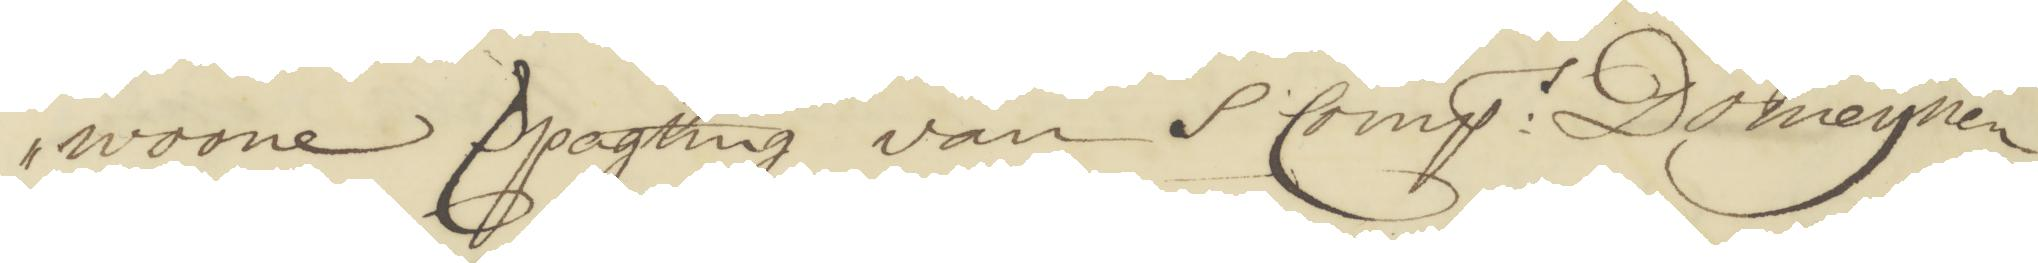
„woone verpagting van ’s Comp:s Domeijnen
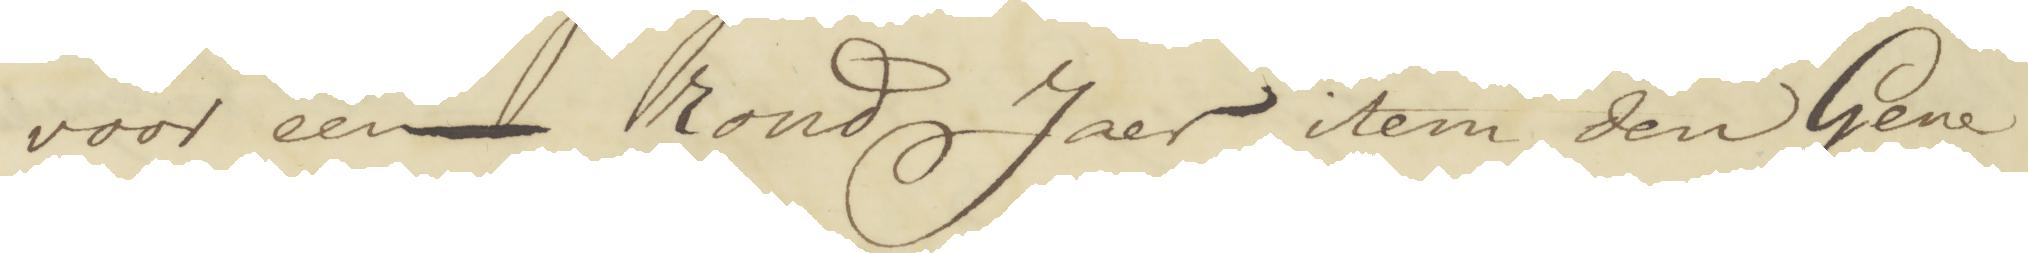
voor een Rond Jaer item den Gene
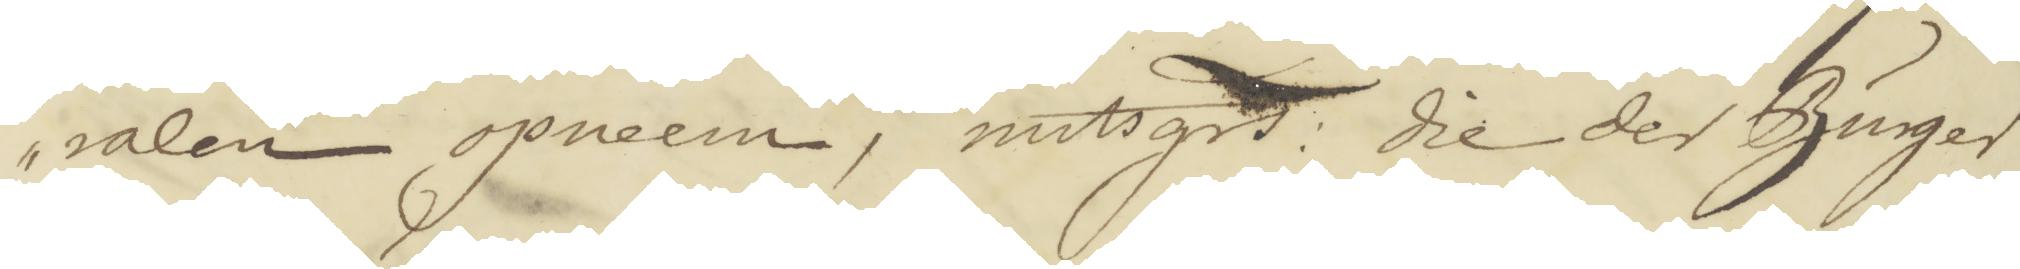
„ralen opneem, mitsgrs: die der Burger
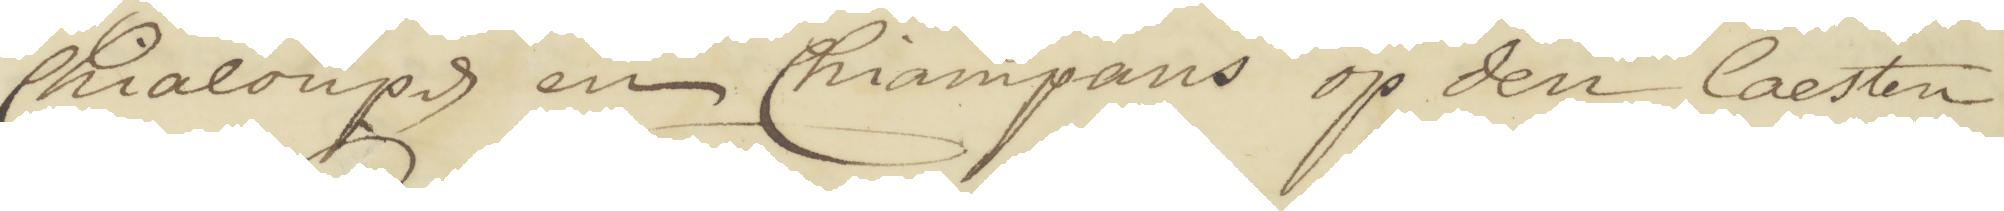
Chialoupen en Chiampans op den laesten
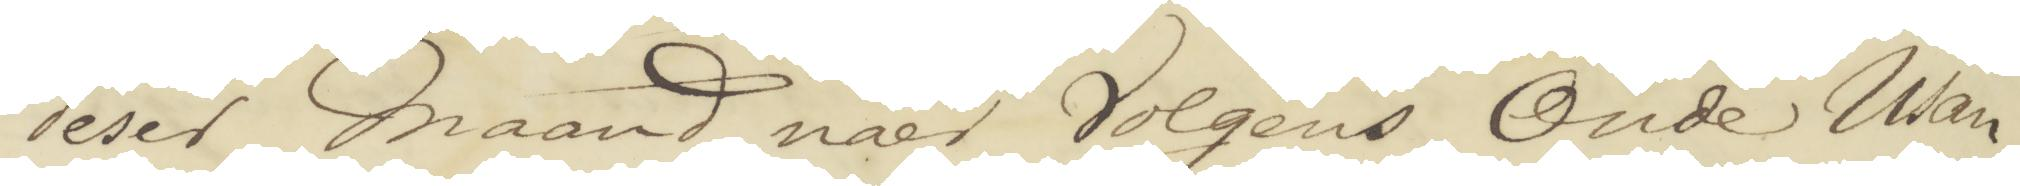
deser maand naer Volgens Oude Usan
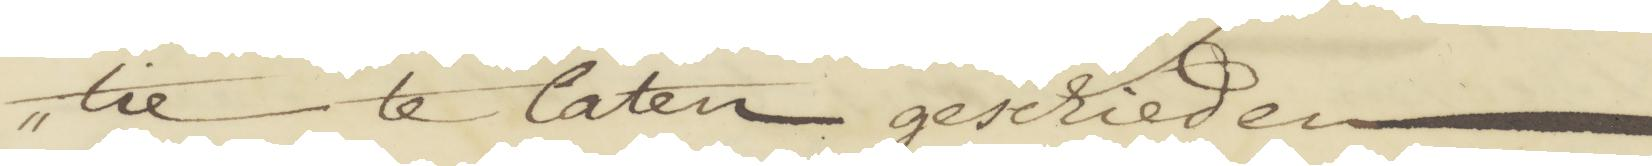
„tie te laten geschieden
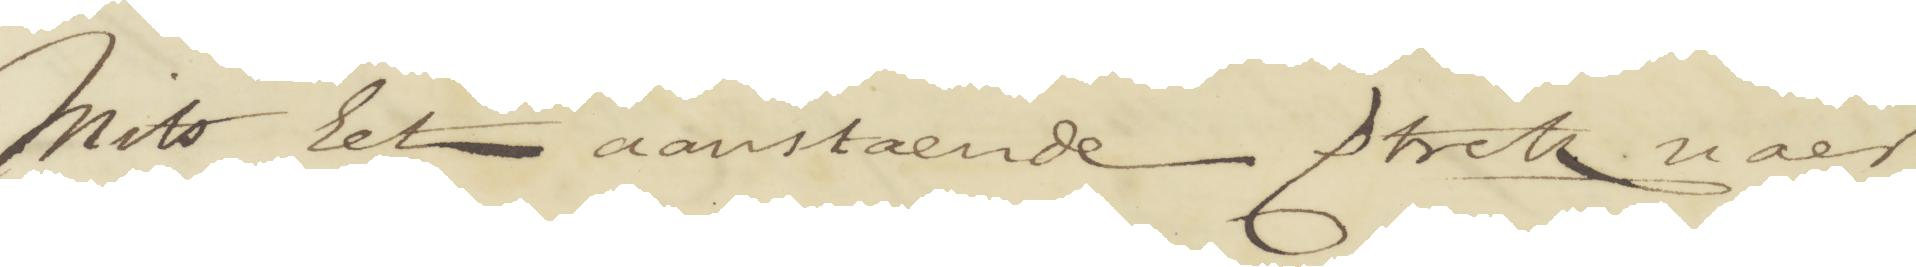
Mits het aanstaende vertrek naer
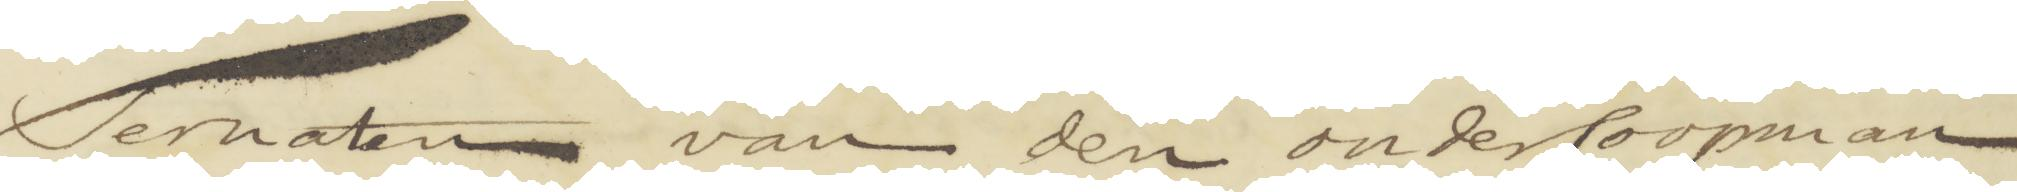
Ternaten van den onderCoopman
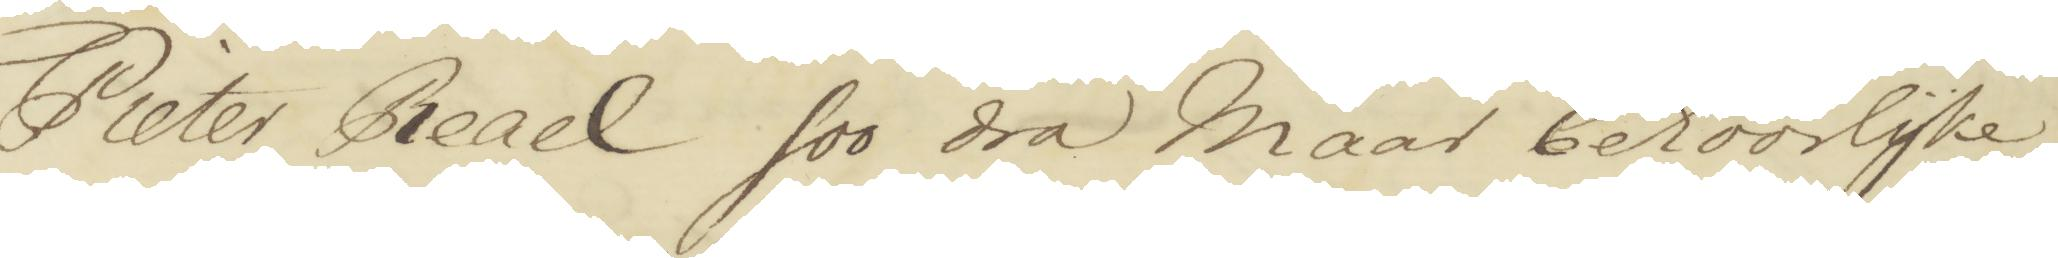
Pieter Reael soo dra Maar behoorlijke
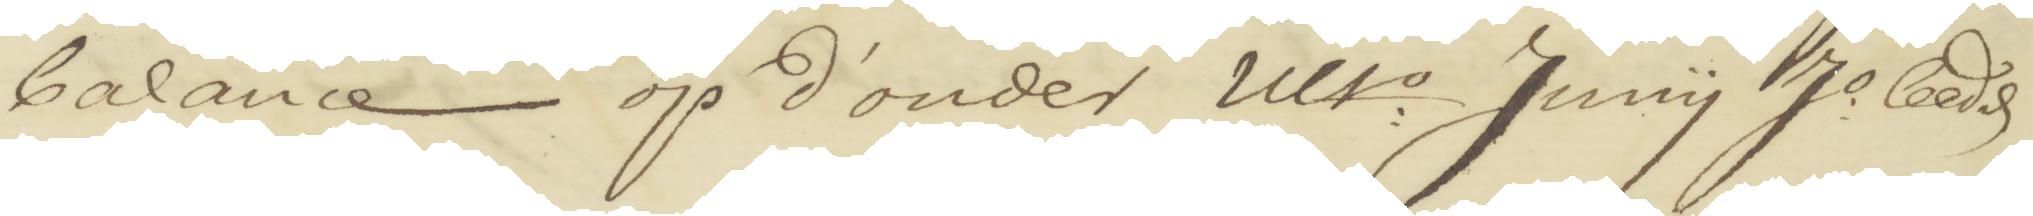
balance op d’onder ult:o Junij J:o leeden
